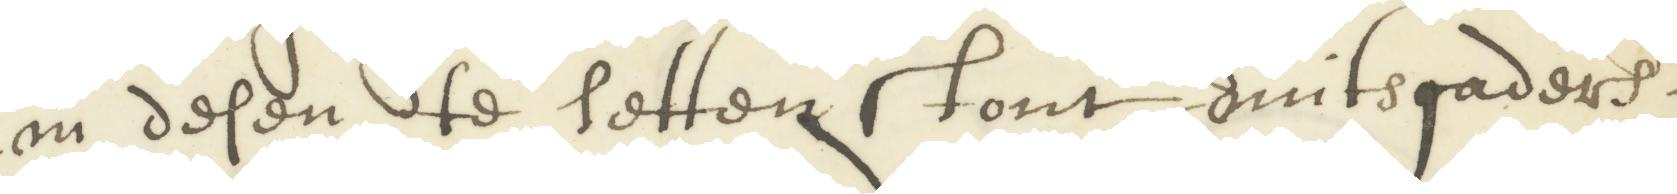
in desen te setten stont mitsgaders
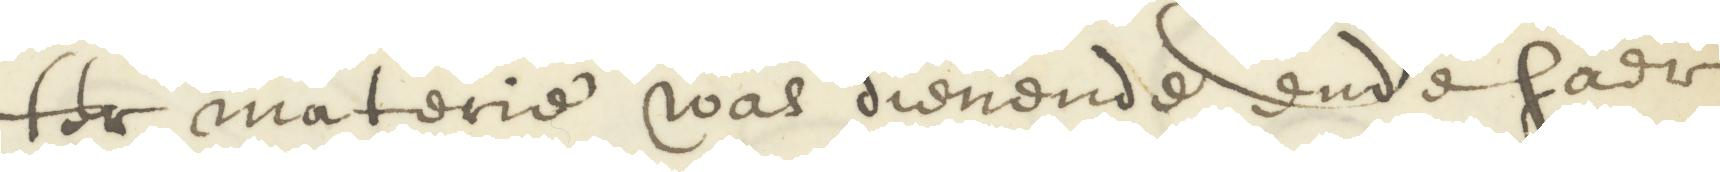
ter materie was dienende ende haer
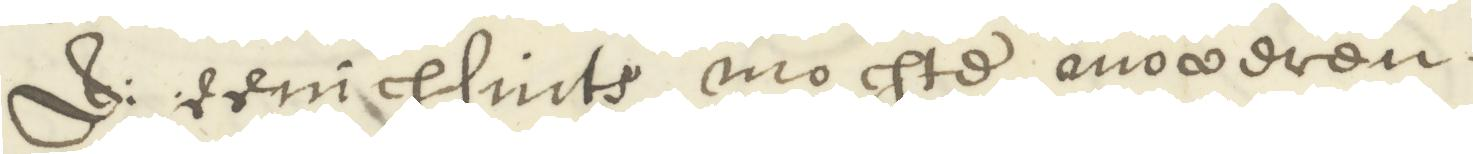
E: eenichsints mochte moveren
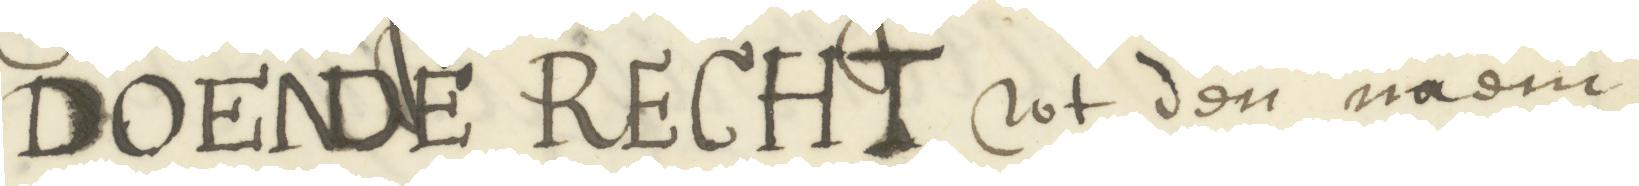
DOENDE RECHT tot den naem
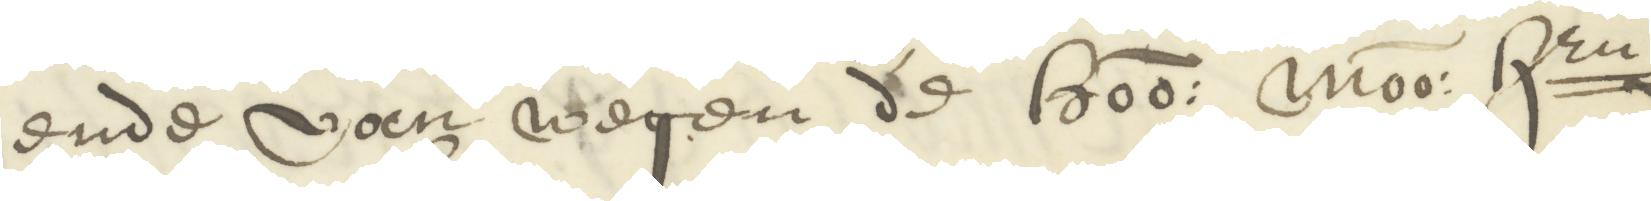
ende van wegen de hoo: moo: H=rn
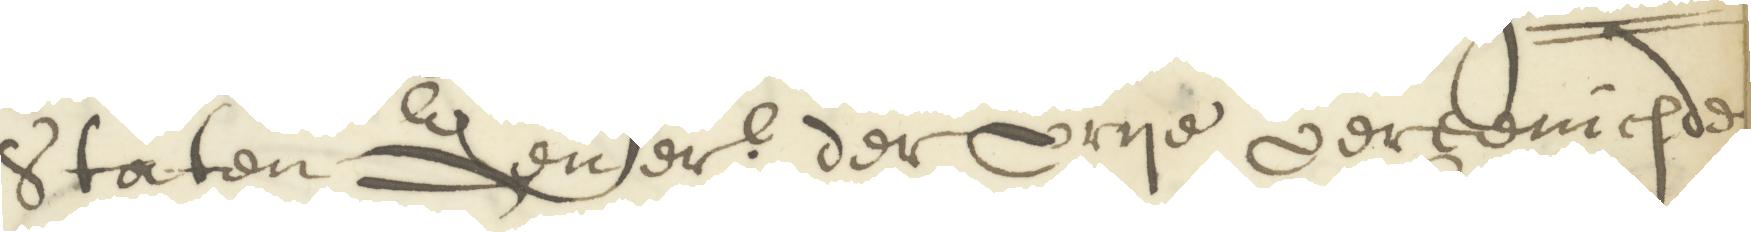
Staten Gener:l der vrye vereenichde
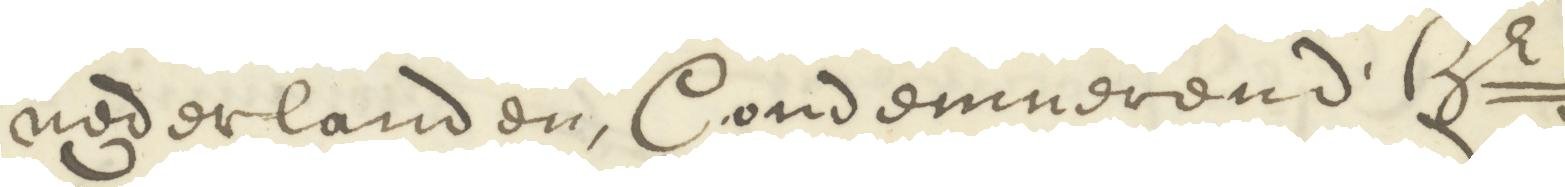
nederlanden, Condemneren d' H=r
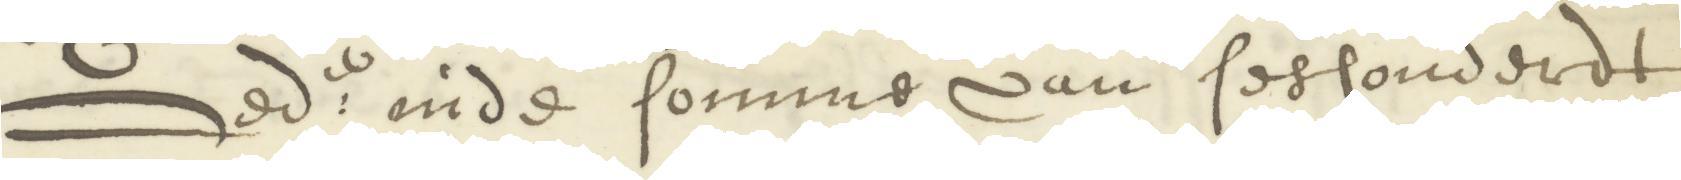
Ged:e oude somme van seshonderdt
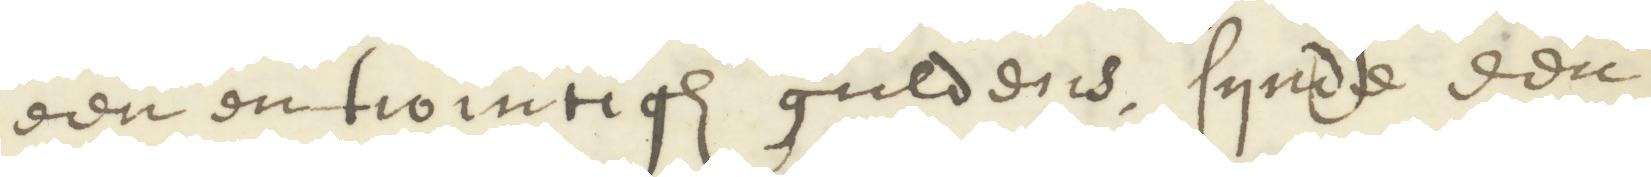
een en twintigh guldens, sijnde een
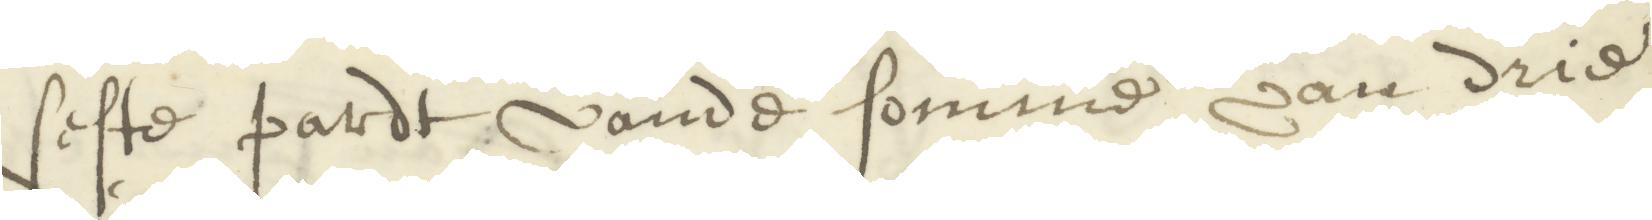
seste pardt vande somme van drie
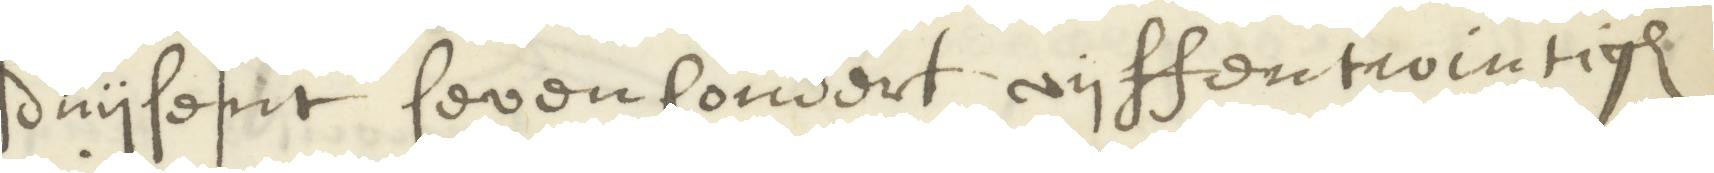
duijsent sevenhondert vijffentwintigh
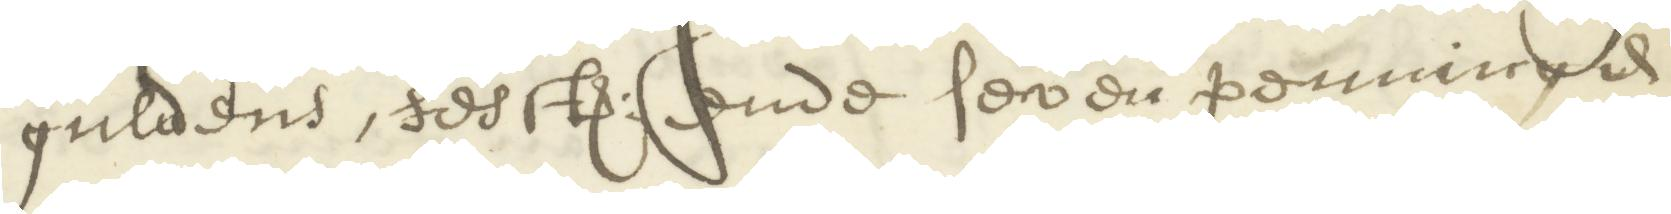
guldens, ses stver: ende seven penningen
